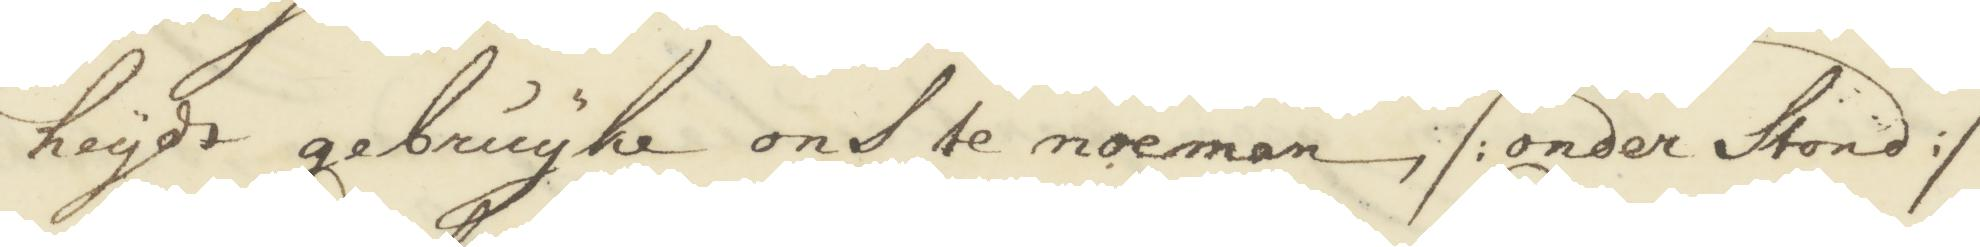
heijdt gebruijke ons te noemen; /:onderstond:/
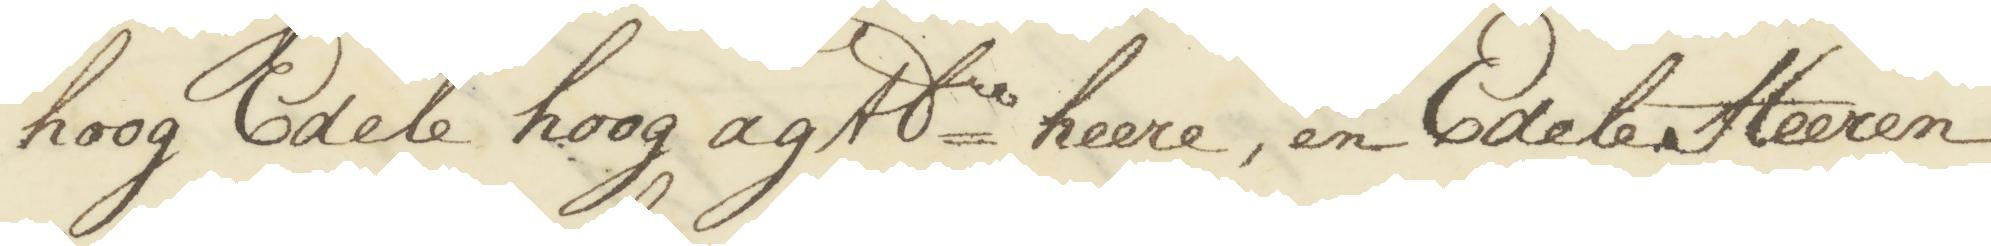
hoog Edele hoog agtb=re heere, en Edele Heeren
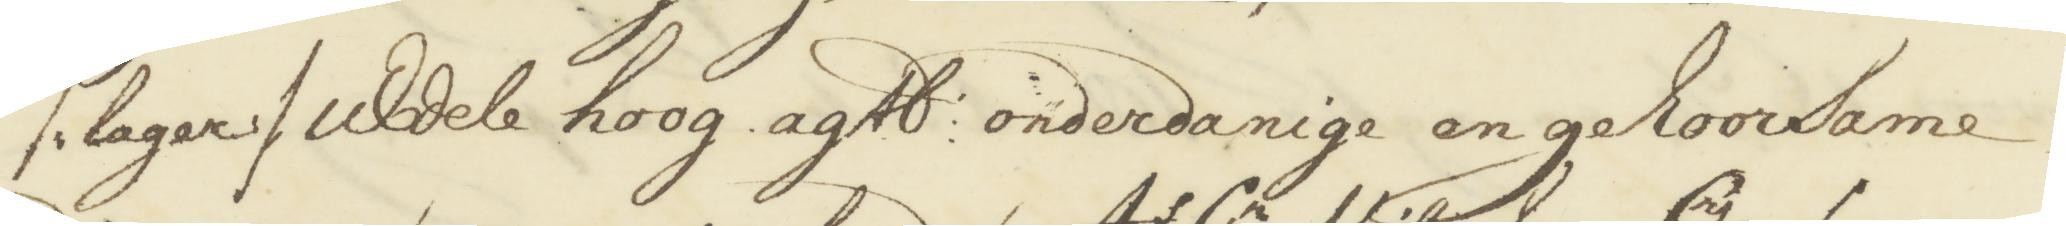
/:lager:/ uEdele hoog agtb: onderdanige en gehoorsame
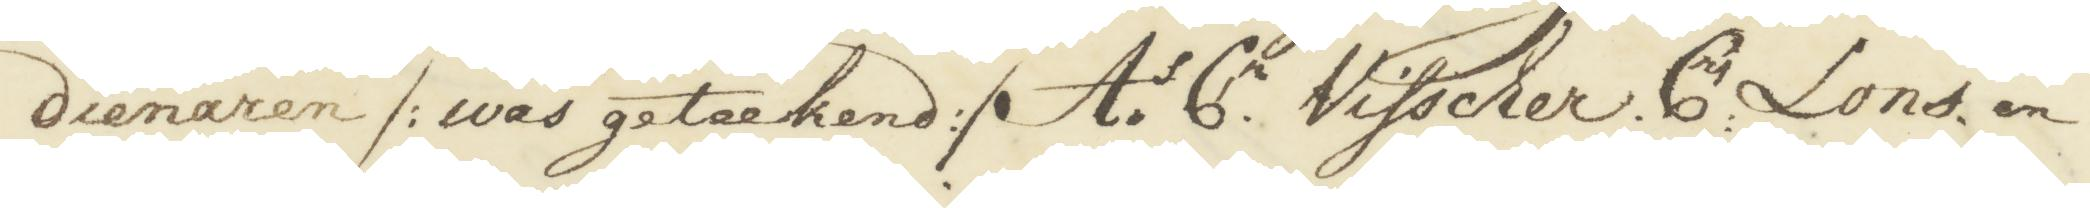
dienaren /:was geteekend:/ A„s C.n Visscher C:rs Lons en
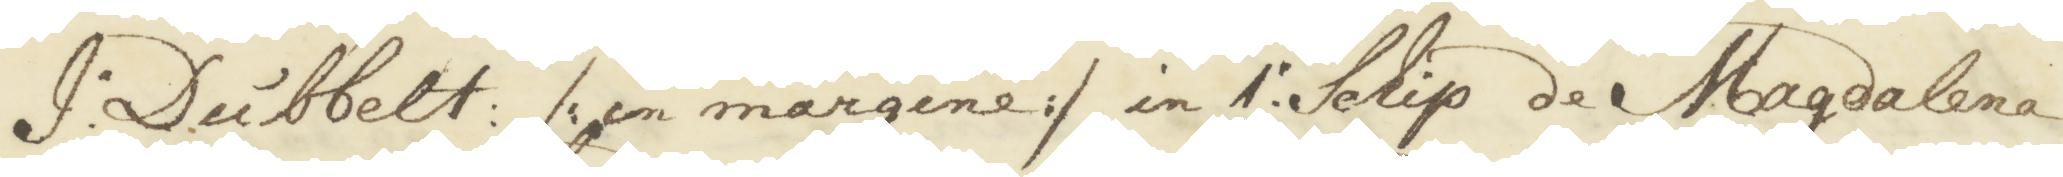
J.n Dubbelt: /:in margine:/ in t' schip de Magdalena
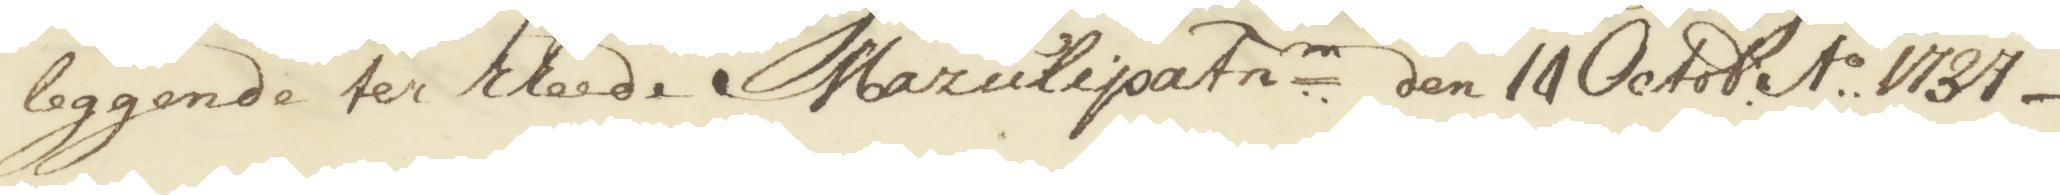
leggende ter rheede Mazulipatn=m den 14 Octob.r A..o 1737 —
